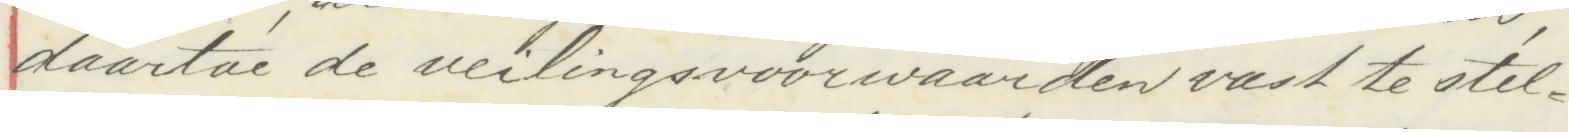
daartoe de veilingsvoorwaarden vast te stel=
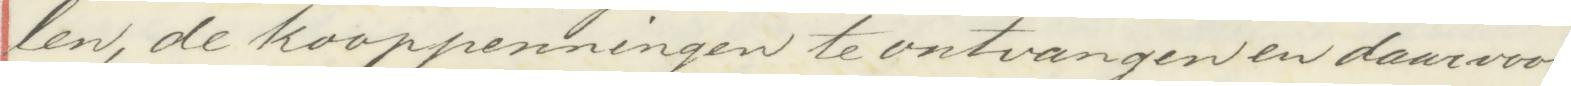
len, de kooppenningen te ontvangen en daarvoor
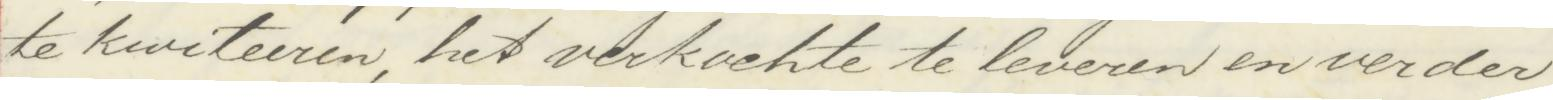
te kwiteeren, het verkochte te leveren en verder
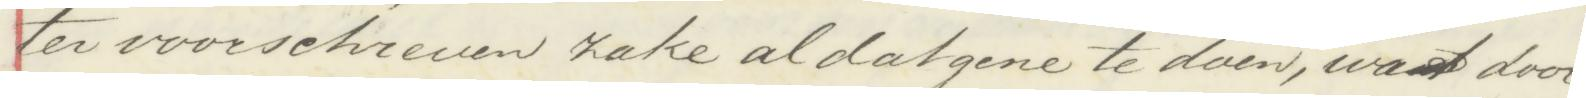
ter voorschreven zake al datgene te doen, wat door
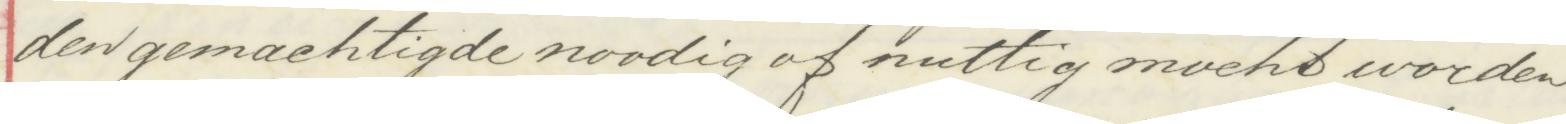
den gemachtigde noodig of nuttig mocht worden
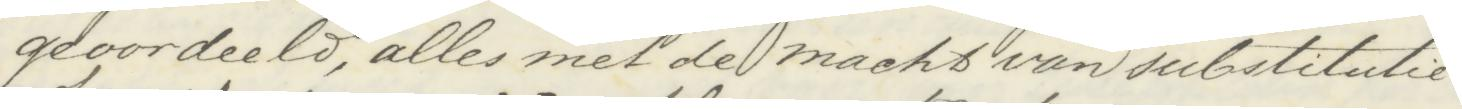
geoordeeld, alles met de macht van substitutie
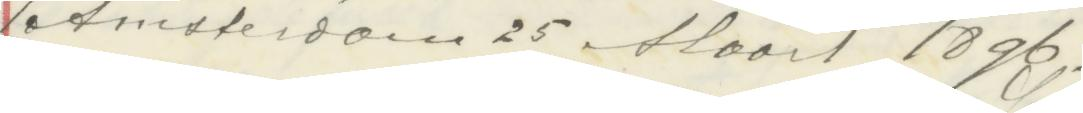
Amsterdam 25 Maart 1896
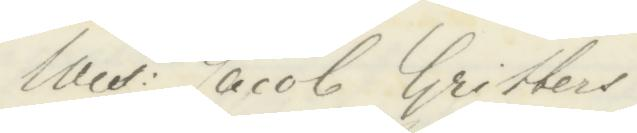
Wed: Jacob Gritters
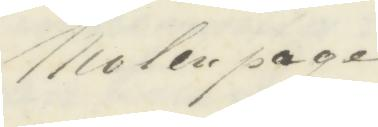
Molenpage
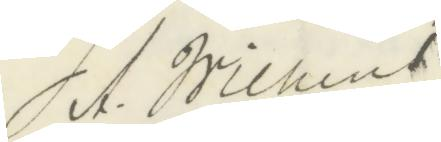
J A Wilkens
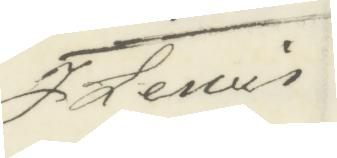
J Lewis
